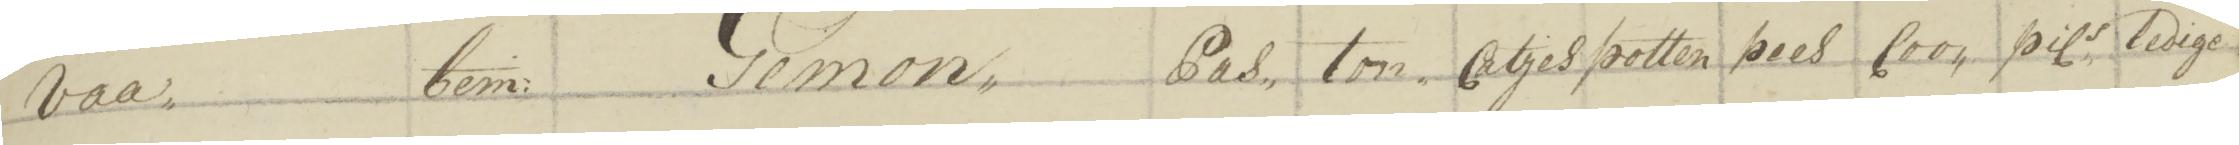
vaa„ bem: Gemon„ Pas„ ton„ Catjes potten pees Coo„ pic„s ledige
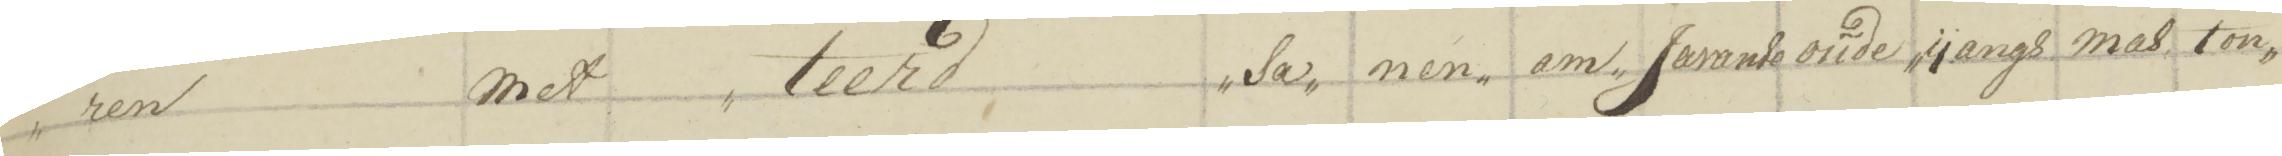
„ren met „teerd „sa„ nen„ am„ Javanse oude „ijangs mas ton„
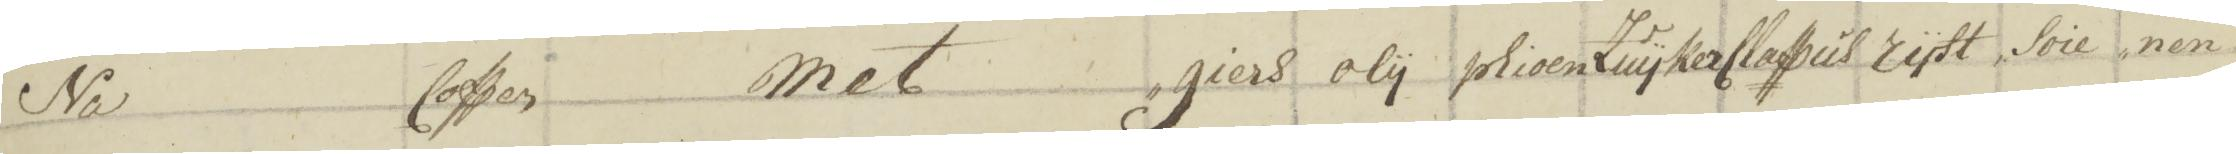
Na Coppen met „giers olij phioen Zuijker Clappus rijst „soie „nen
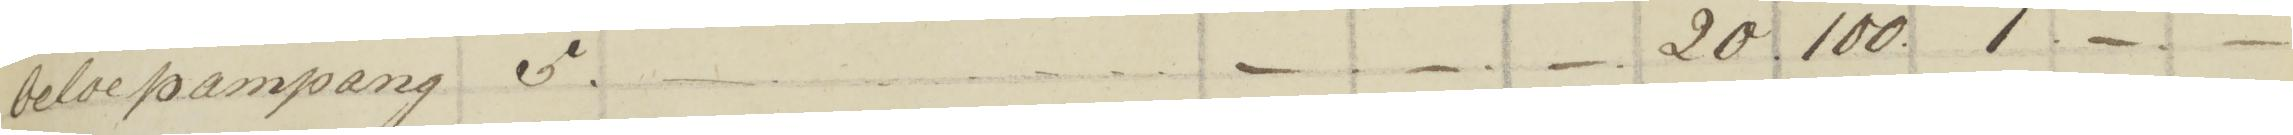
beloepampang 5. — - - - - - - —. —. —. 20. 100. 1. —. —
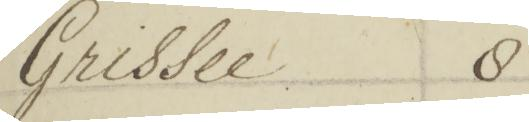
Grissee 8
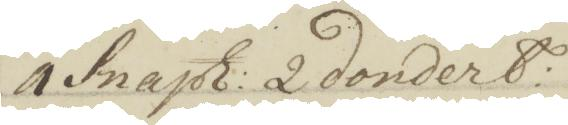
4 snaph: 2 donderb:
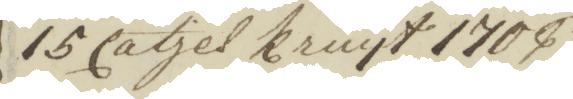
15 Catjes kruijt 170 p„s
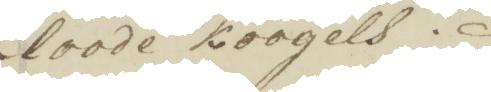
loode koogels. —
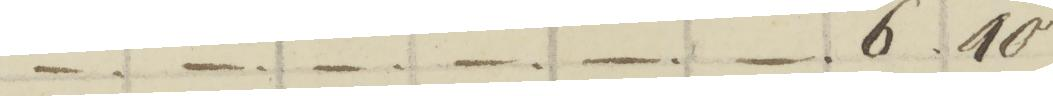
—. —. —. —. —. —. 6. 40
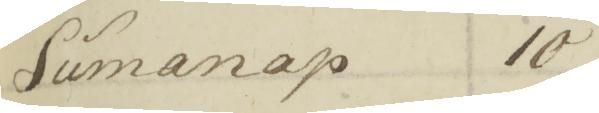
Sumanap 10
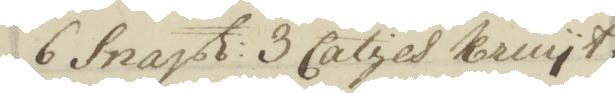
6 snaph: 3 Catjes kruijt
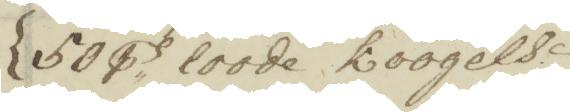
{ 50 p„s loode koogels.—
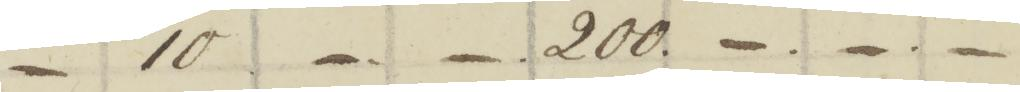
— 10. —. —. 200. —. —. —
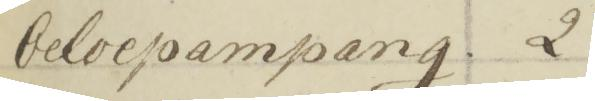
beloepampang. 2
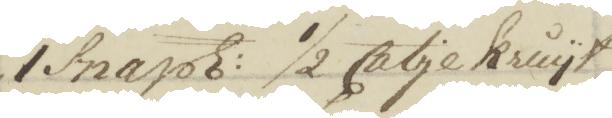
1 snaph: ½ Catje kruijt
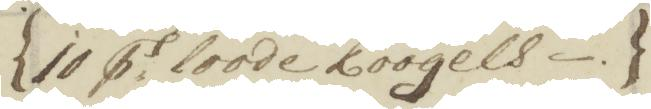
{ 10 p„s loode koogels —. }
